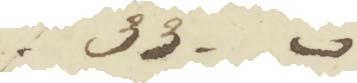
ƒ 33 „ —
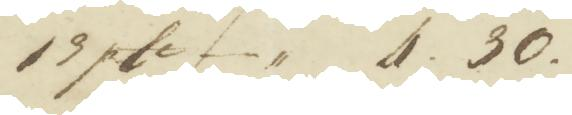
13 pCt - „ 4. 30.
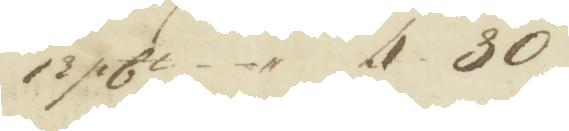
13 pCt - - „ 4. 30
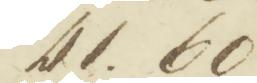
41. 60
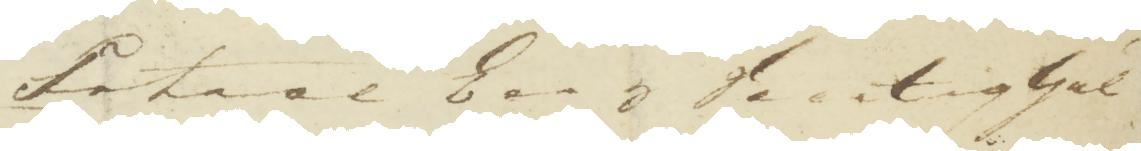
Totaal Een en Veertig Gul
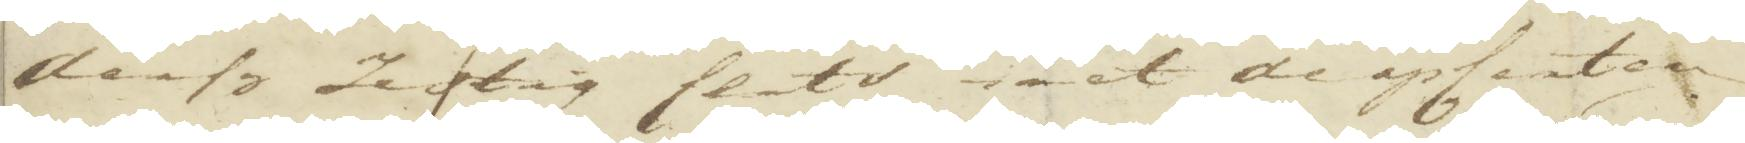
dens en Zestig Cents met de opCenten
